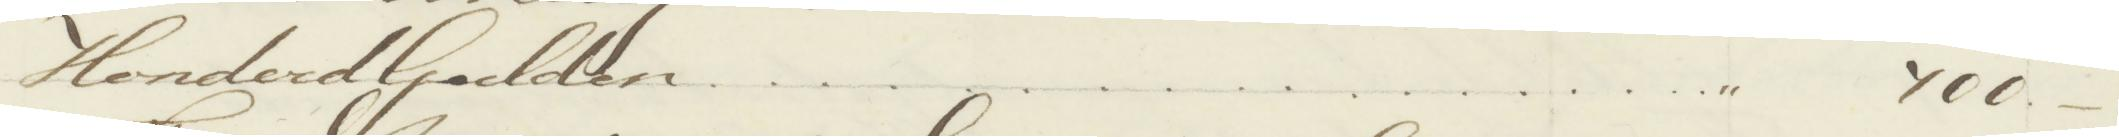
Honderd Gulden . . . . . . . . . . . . . . . . . . „ 700. —
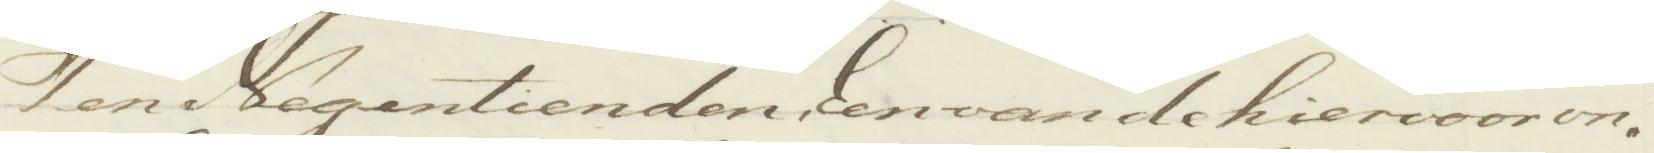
Ten Negentienden, Een van de hiervoor on„
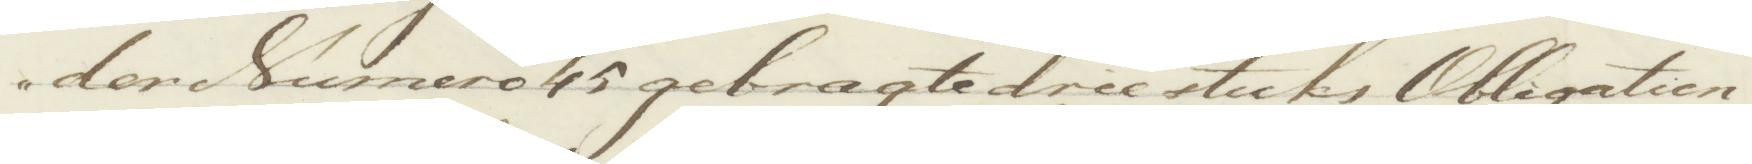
„der Numero 45 gebragte drie stuks Obligatien
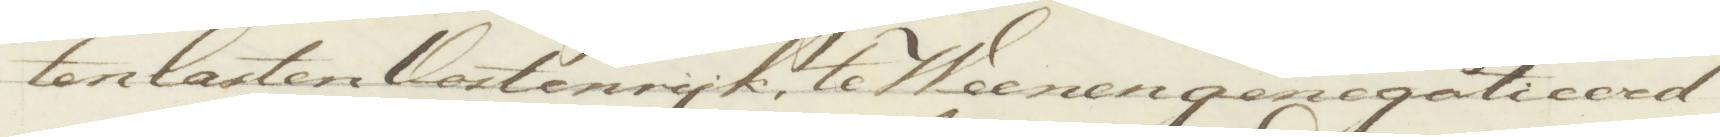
ten lasten Oostenrijk, te Weenen genegotieerd
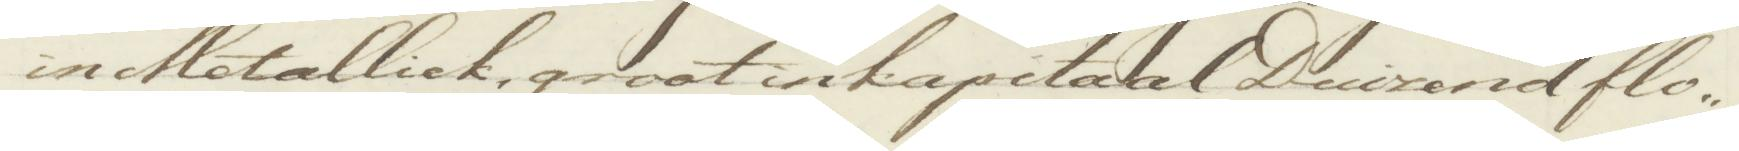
in Metalliek, groot in kapitaal Duizend flo„
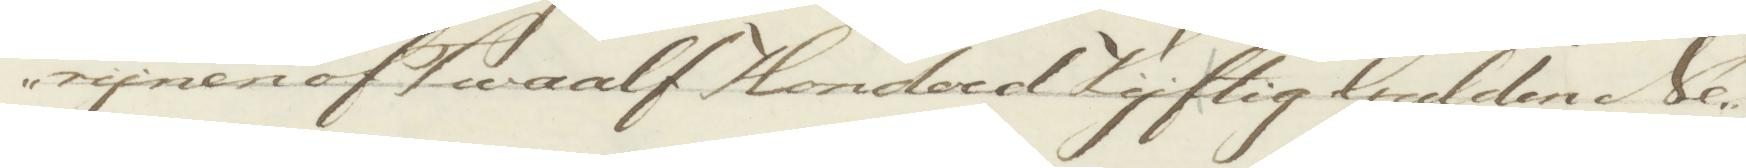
„rijnen of Twaalf Honderd Vijftig Gulden Ne„
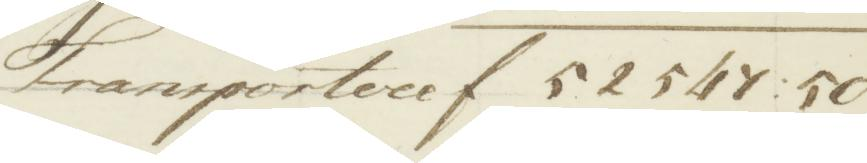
Transportere ƒ 52547: 50
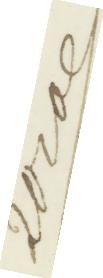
20 roe
